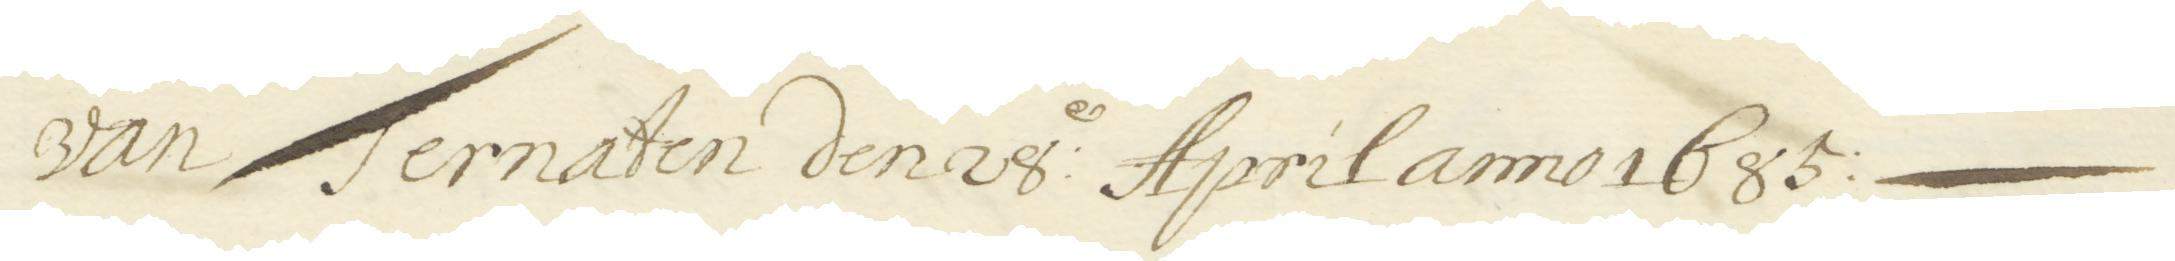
van Ternaten den 28:e April anno 1685: —
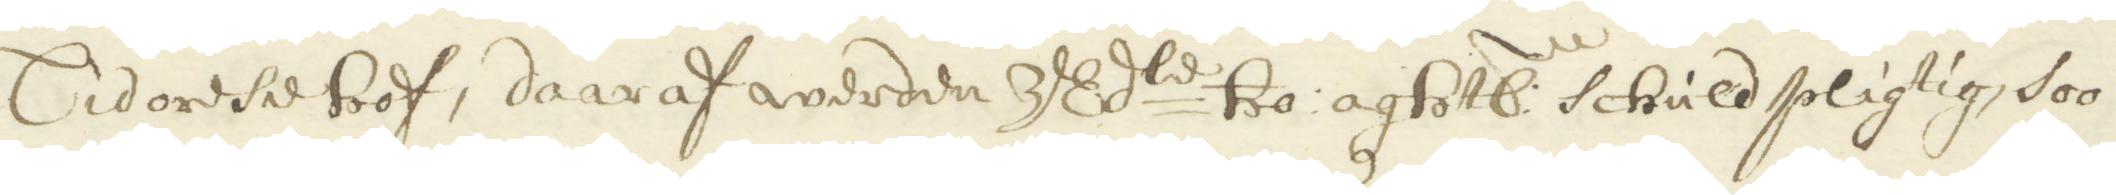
Tidorese hof, daar af werden VEd=le Ho: aghtb:' schuldpligtig, soo
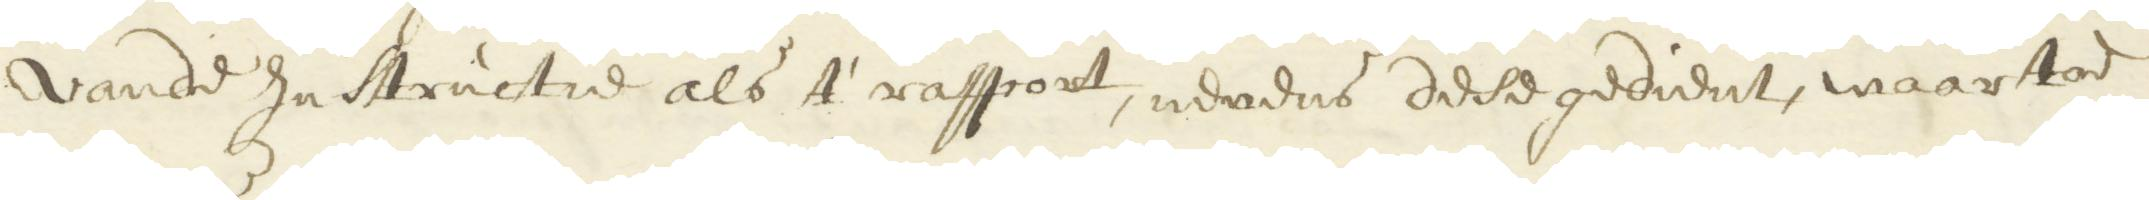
van de Jnstructie als t' rapport, nevens dese gedient, waartoe
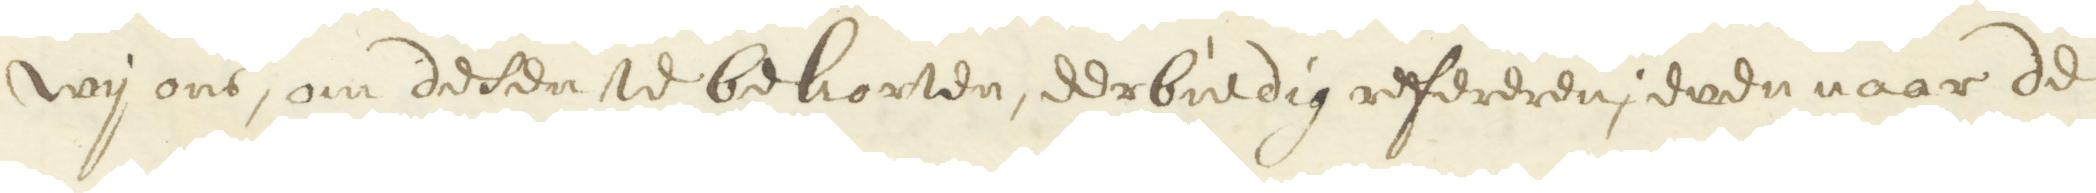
wij ons, om desen te bekorten, eerbiedig refereren; even naar de
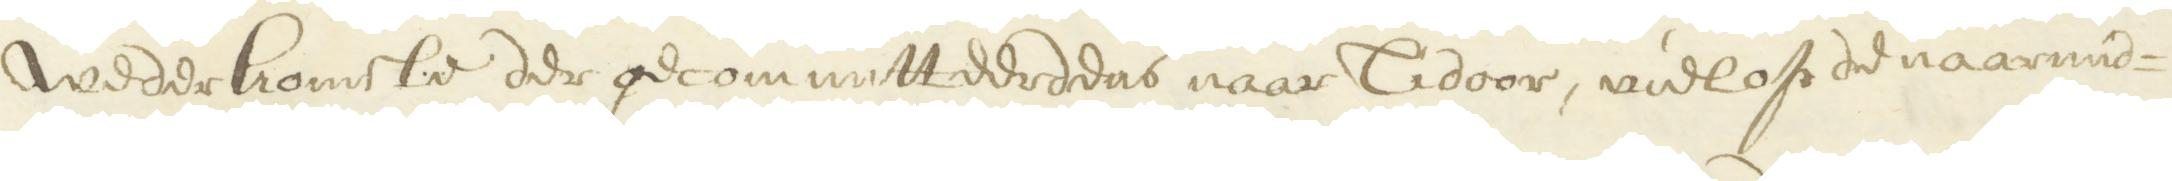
wederkomste der gecommitteerdens naar Tidoor, viel op de naarmid=
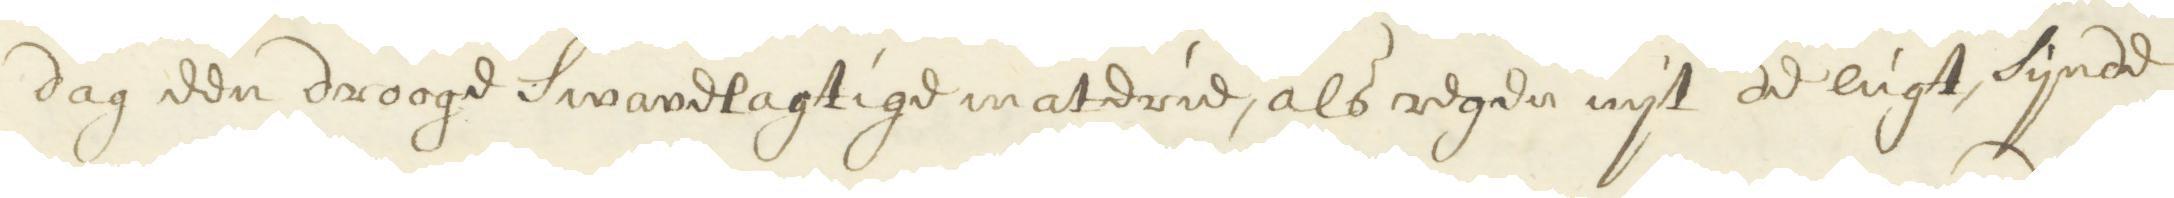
dag een drooge swavelagtige materie, als regen uijt de lugt, sijnde
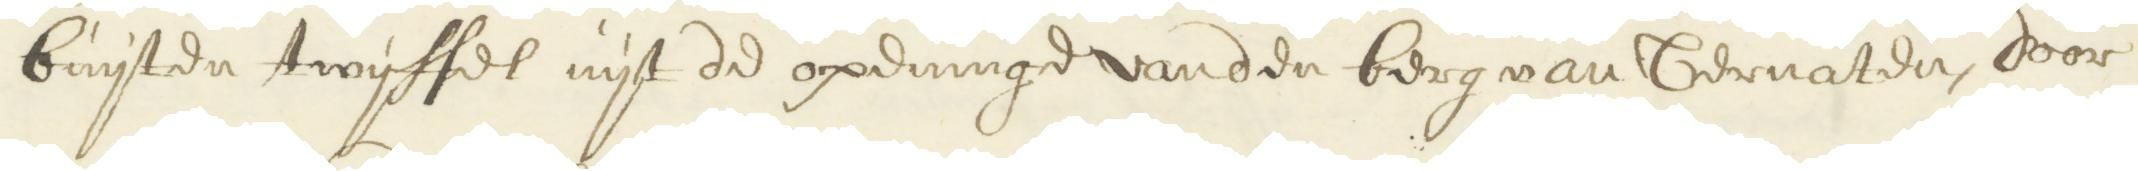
buijten twijffel uijt de openinge vanden berg van ternaten, door
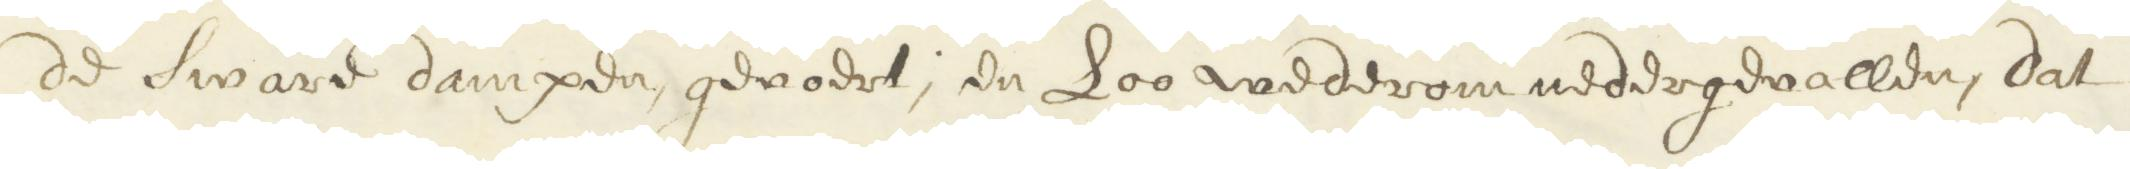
de sware dampen, gevoert; en zoo wederom nedergevallen, dat
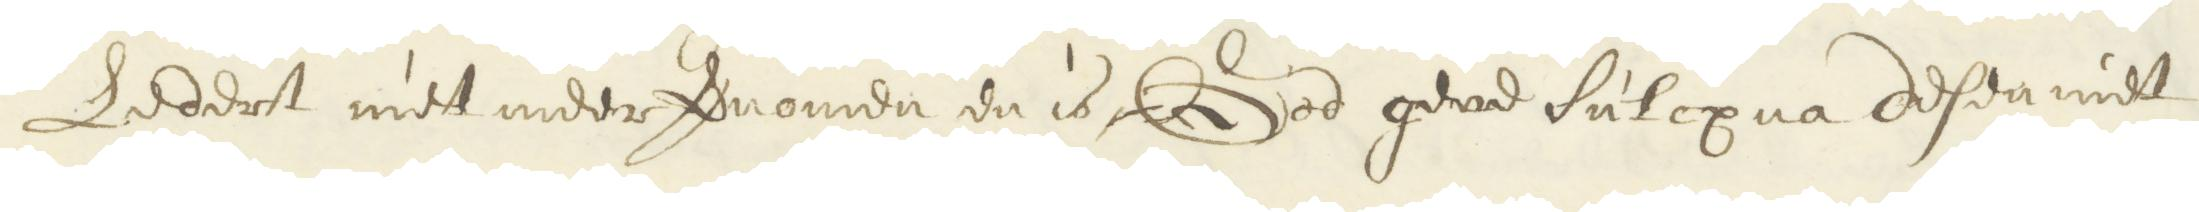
zedert niet meer vernomen en is, God geve sulcx na desen niet
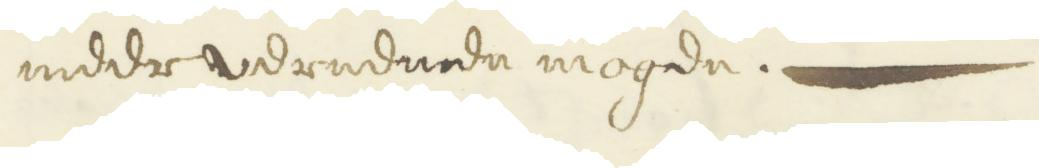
meer vernemen mogen. —
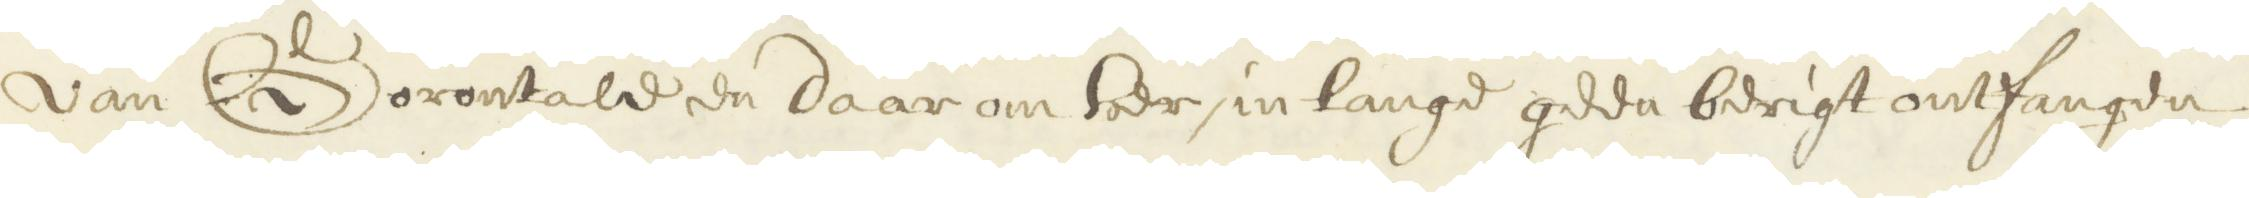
van Gorontale en daar om her, in lange geen berigt ontfangen
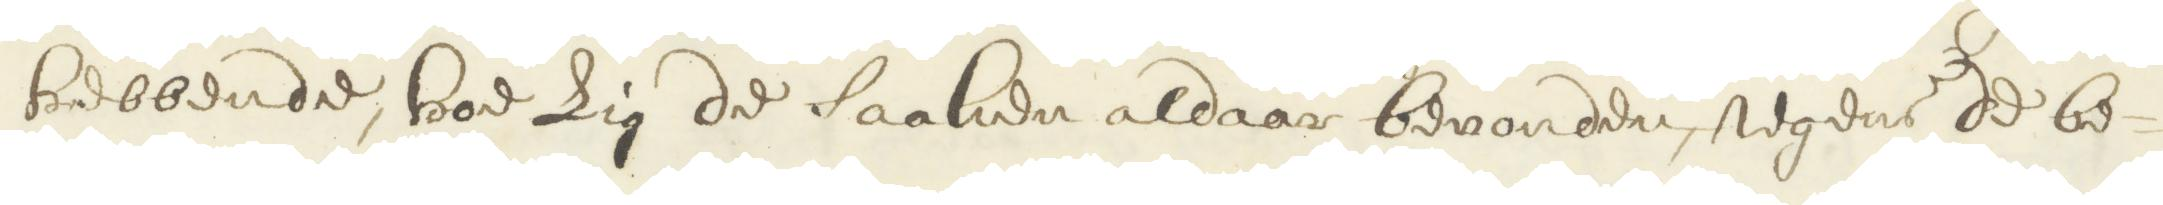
hebbende, hoe zig de saaken aldaar bevonden, tegens de be=
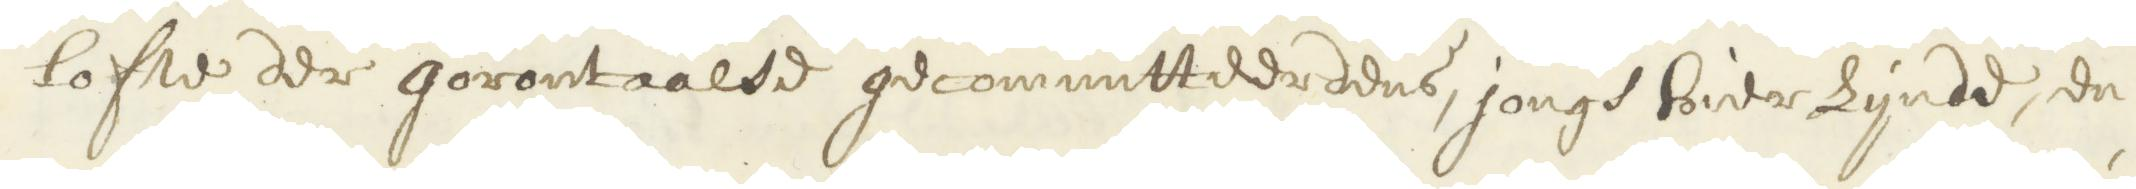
lofte der gorontaalse gecommitteerdens, jongs hier zijnde, en
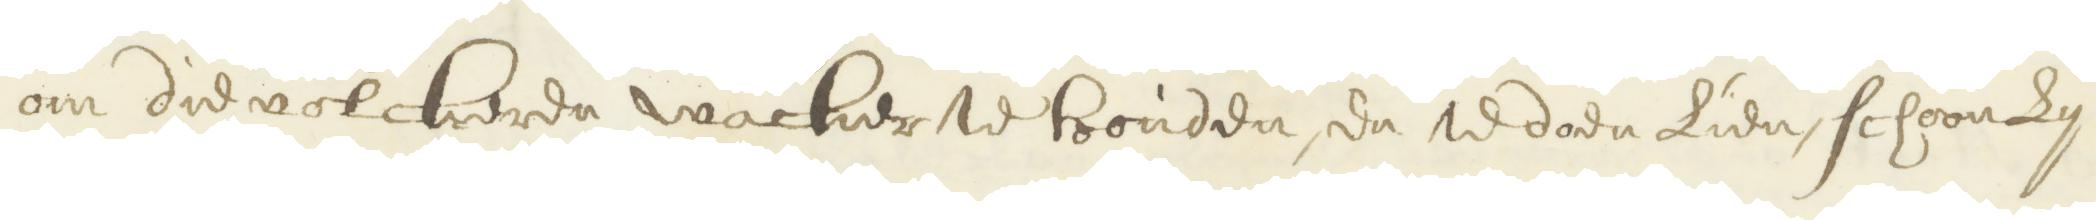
om die volckeren wacker te houden, en te doen zien, schoon zij
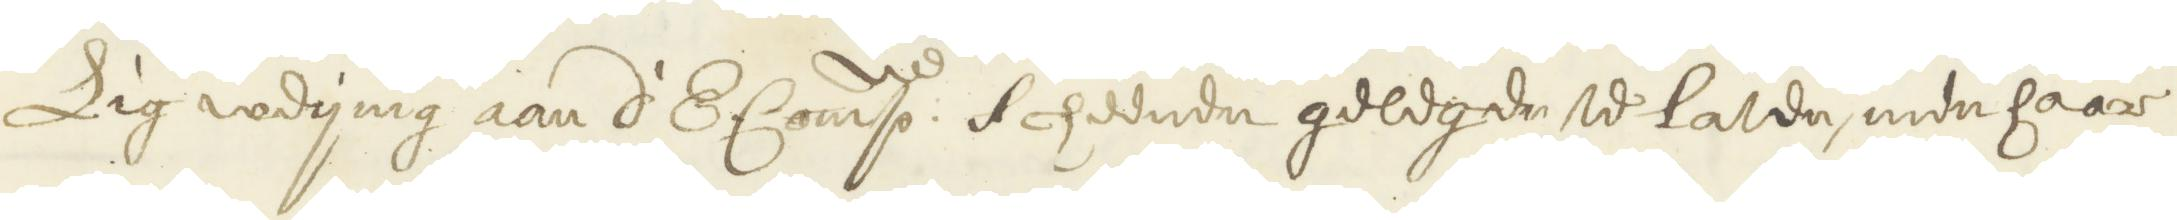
zig weijnig aan d’ E Comp: scheenen gelegen te laten, men haar
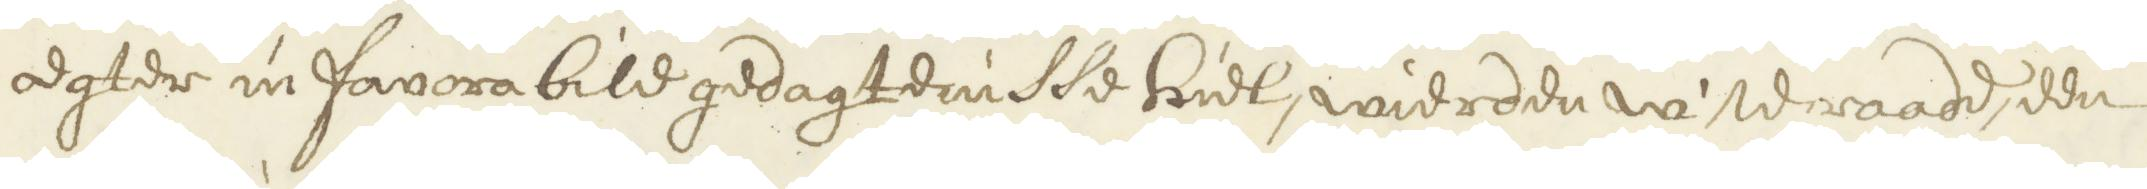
egter in favorabile gedagtenisse hiel, wierden w' te raade, een
